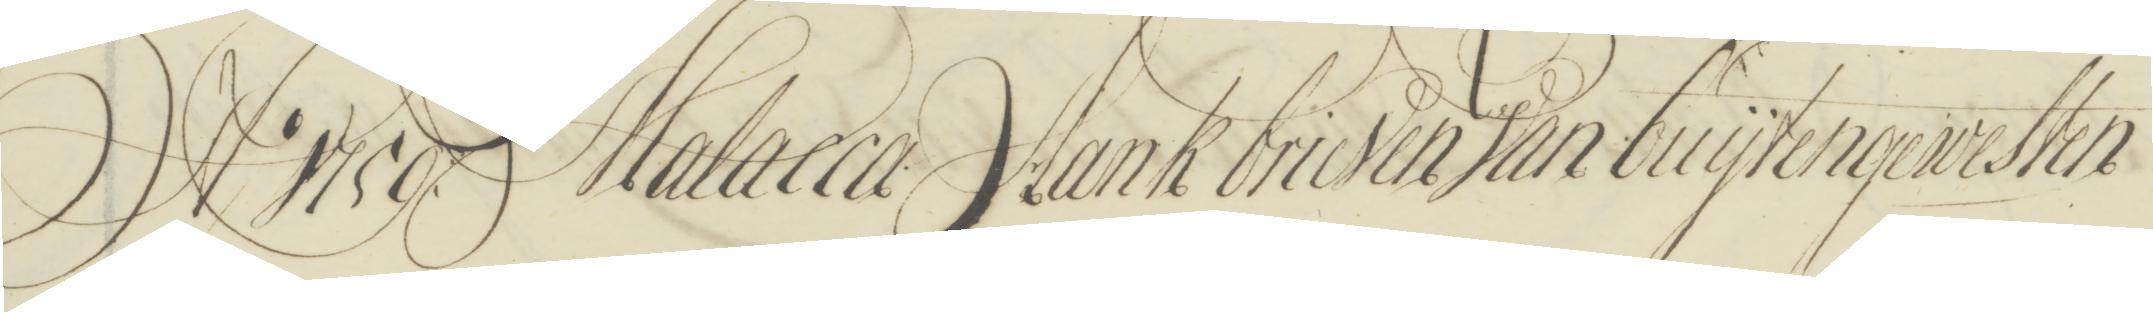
A,o 1759: Malacca Aank brieven van buijtengewesten
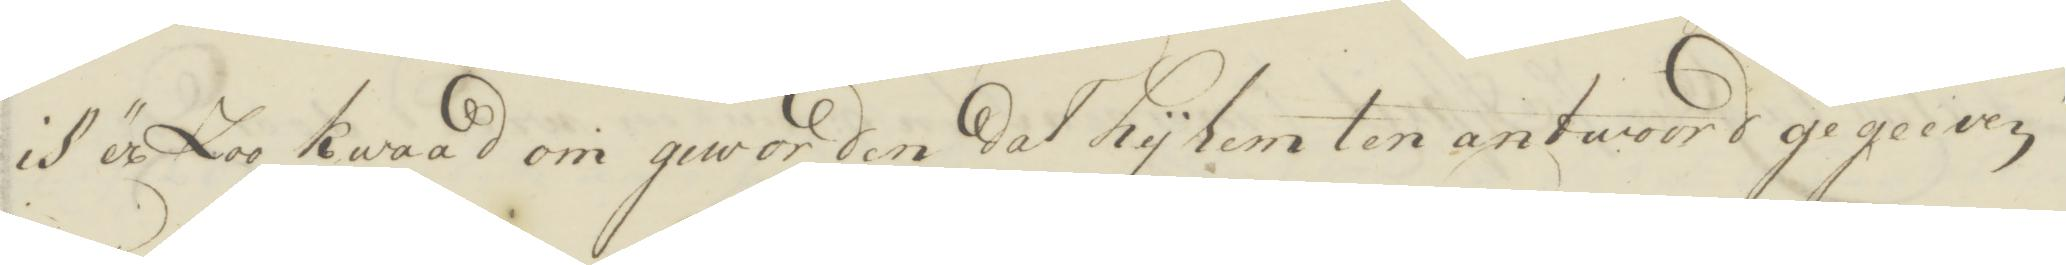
is ''er zoo kwaad om geworden dat hij hem ten antwoord gegeeven
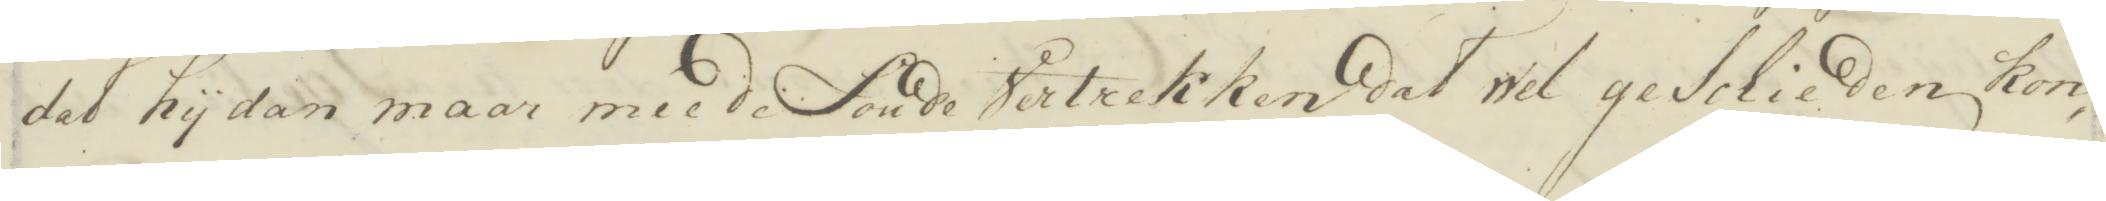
dat hij dan maar meede soude vertrekken dat wel geschieden kon,
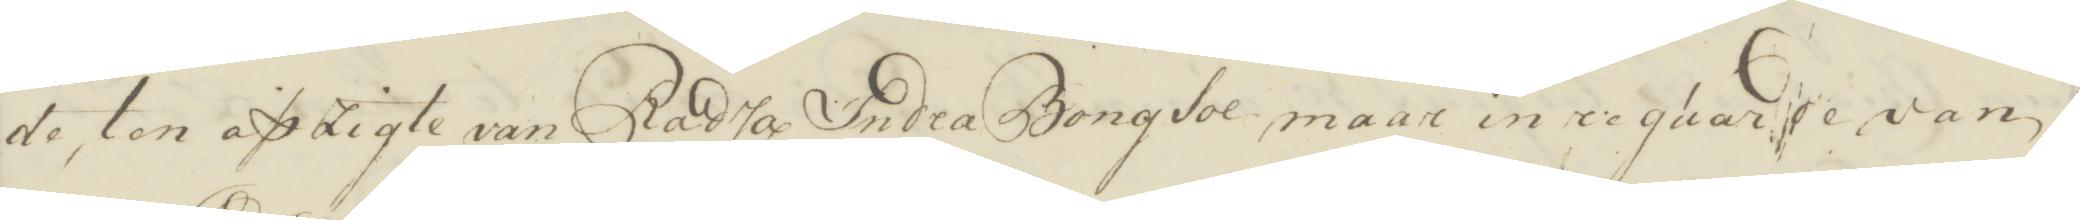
de, ten opzigte van Radja Indra Bongsoe, maar in reguarde van
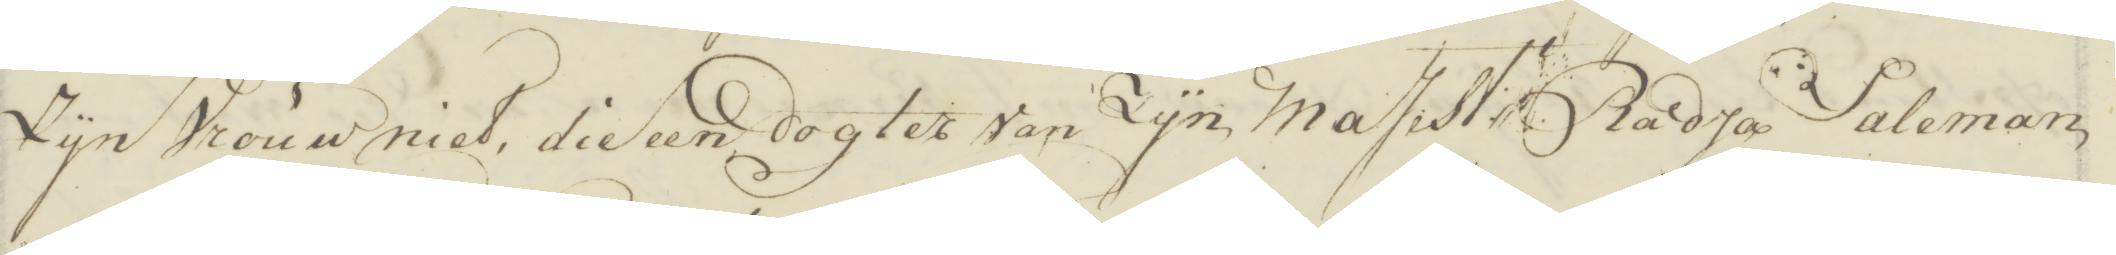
zijn Vrouw niet, die een dogter van zijn majist„t Radja Saleman
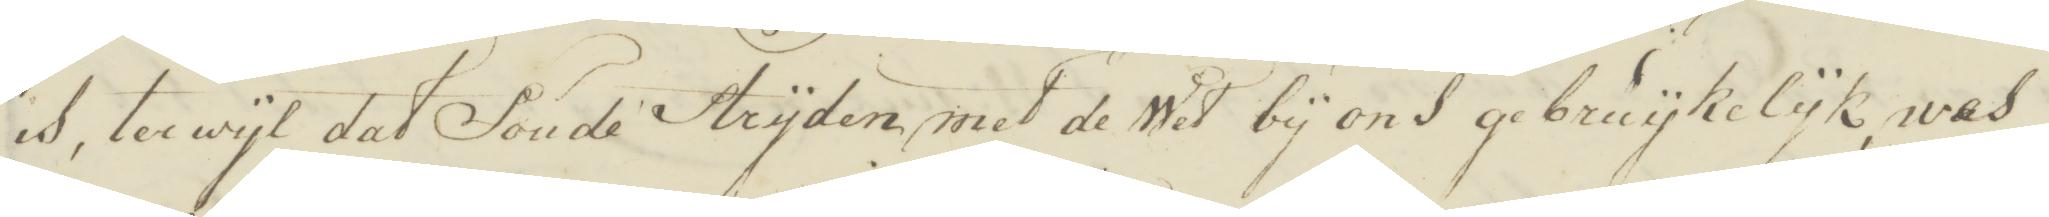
is, terwijl dat soude strijden met de wet bij ons gebruijkelijk, was
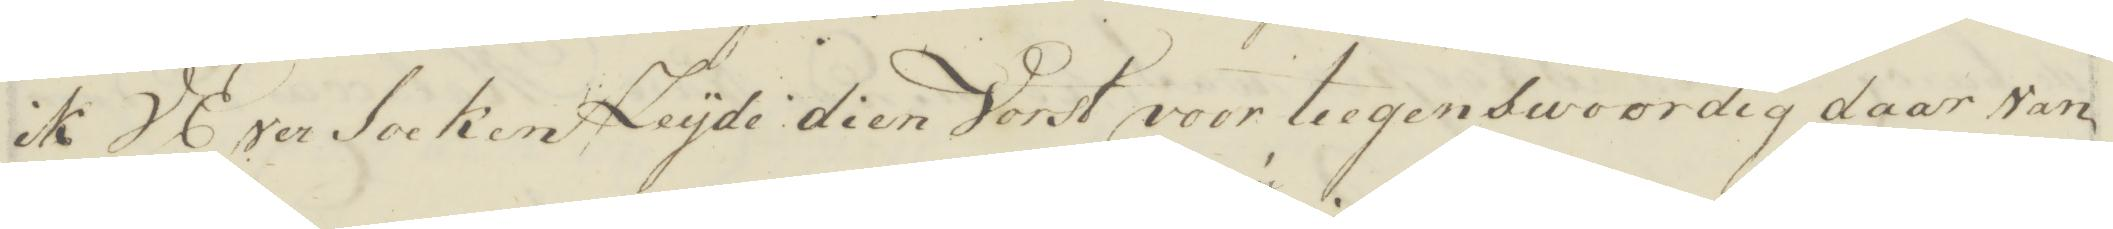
ik VE versoeken zeijde dien Vorst voor teegenswoordig daar van
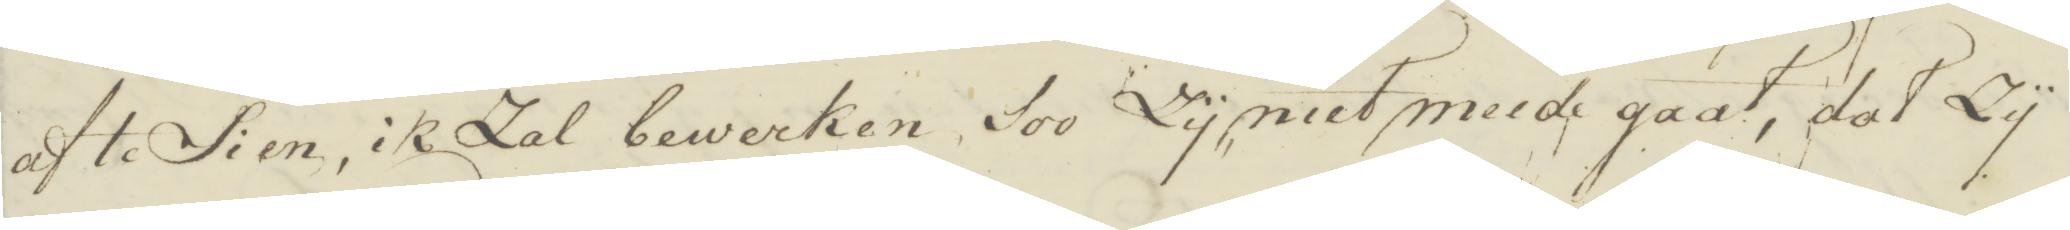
af te sien, ik zal bewerken, soo zij niet meede gaat, dat zij
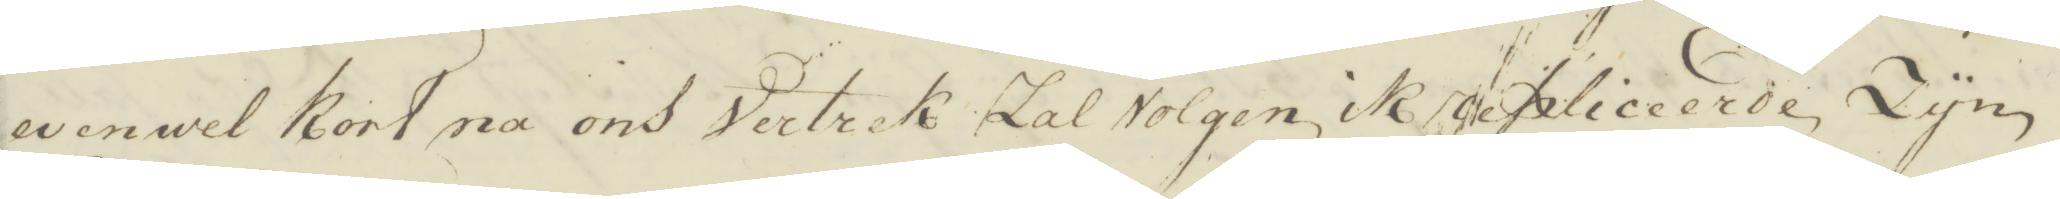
evenwel kort na ons vertrek zal volgen ik repliceerde, zijn
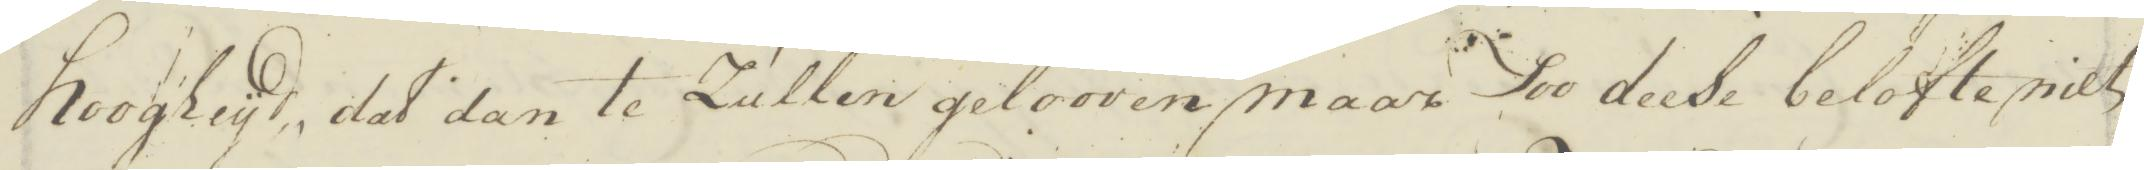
Hoogheijd, dat dan te zullen gelooven, maar soo deese belofte niet
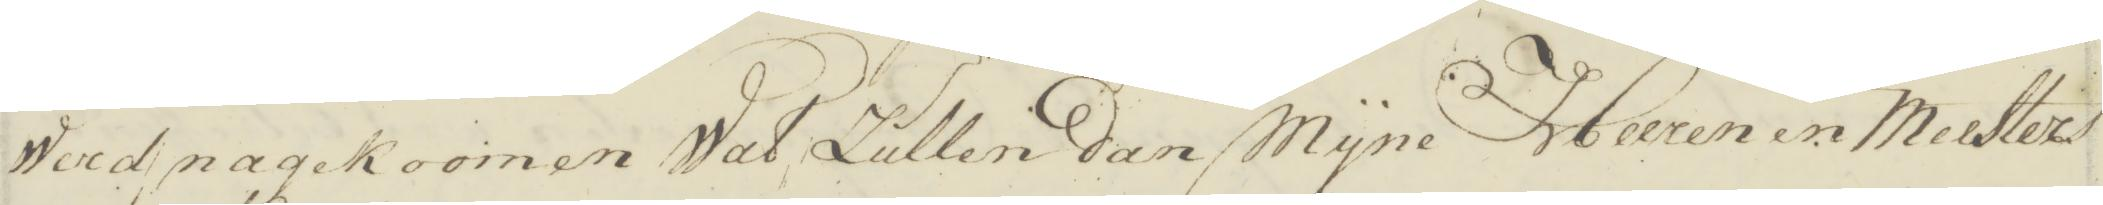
werd nagekoomen wat zullen dan mijne Heeren en Meesters
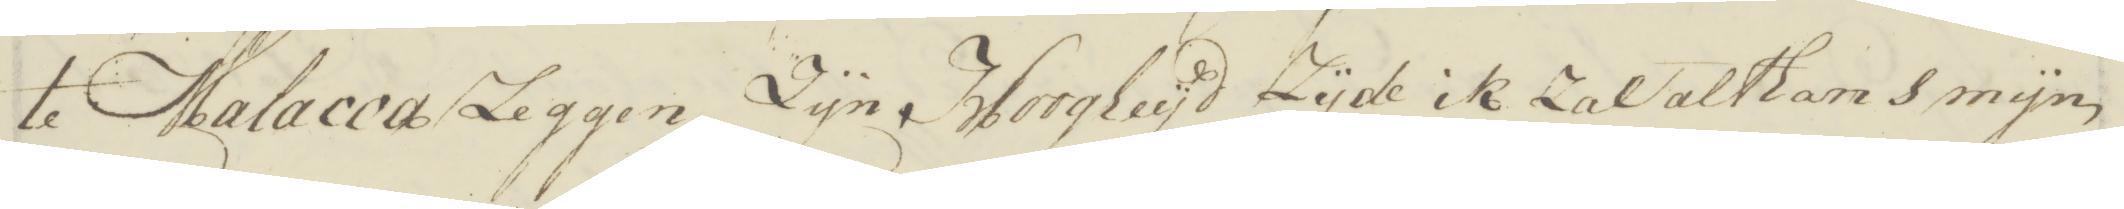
te Malacca zeggen, zijn Hoogheijd zijde ik zal althans mijn
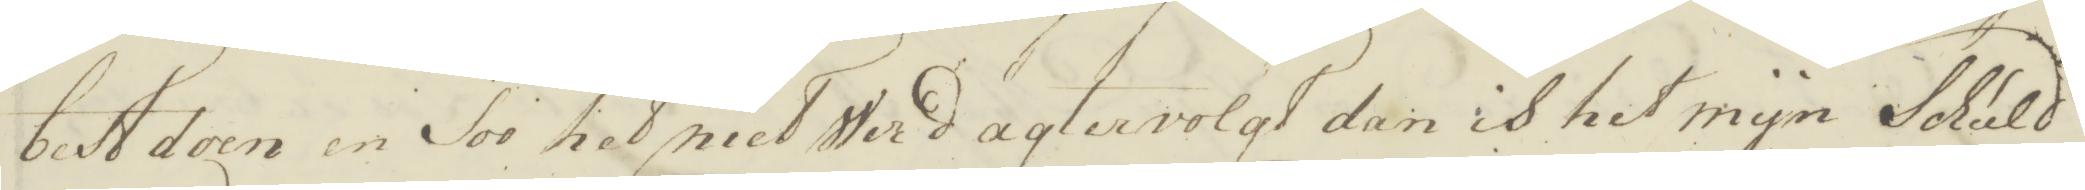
best doen en soo het niet werd agtervolgt dan is het mijn schuld
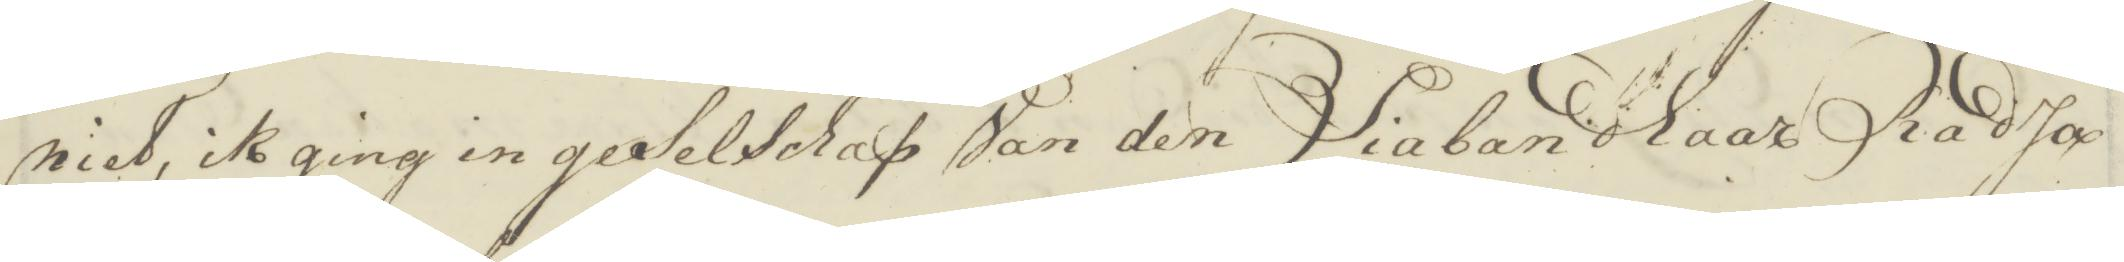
niet, ik ging in geselschap van den Siabandhaar Radja
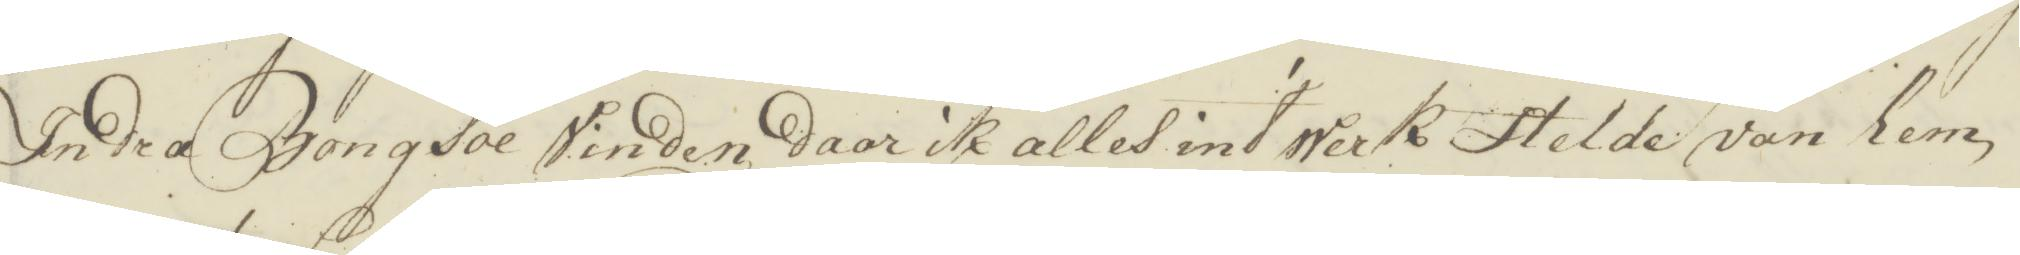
Indra Bongsoe vinden daar ik alles in't werk stelde van hem
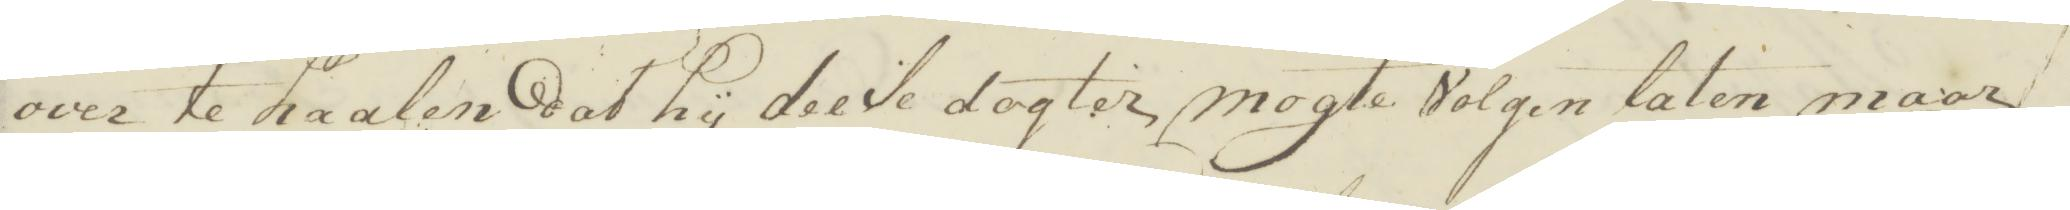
over te haalen dat hij deese dogter mogte volgen laten maar
